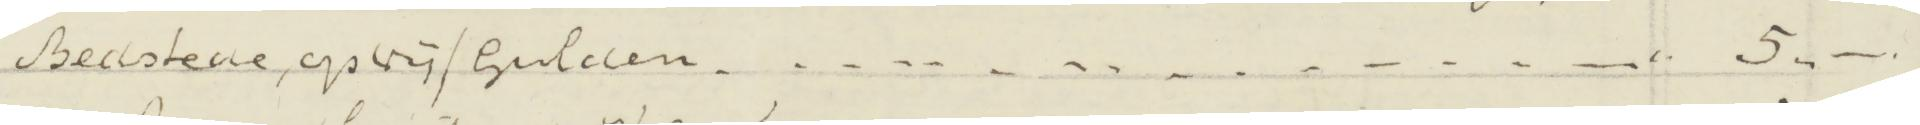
Bedstede, op vijf Gulden - - - - - - - - - - - - - - - „ 5 „ — .
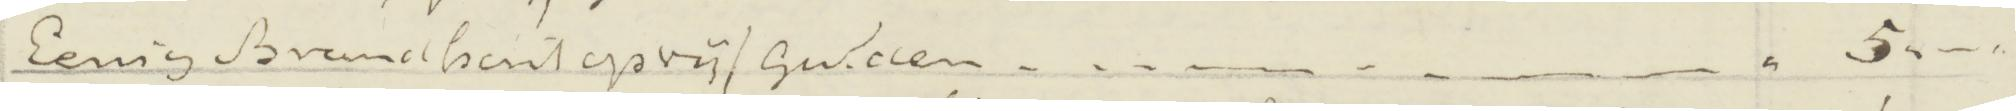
Eenig Brandhout op vijf Gulden - - - - - - - - - - - „ 5„ — „
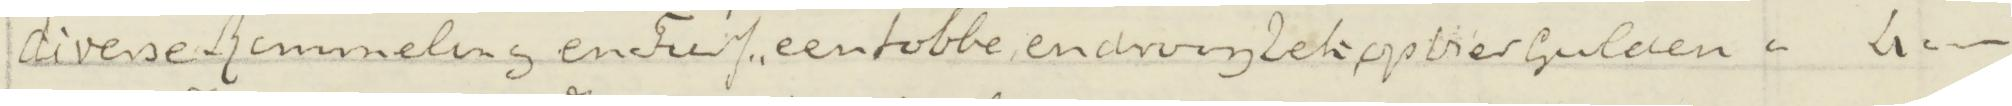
diverse Rommeling en Turf, een tobbe, en droogrek, op Vier Gulden „ 4„—
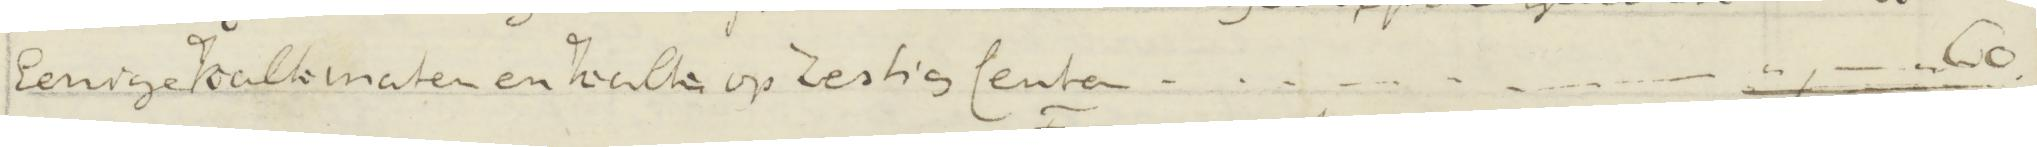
Eenige kalkmaten en kalk op zestig Centen - - - - - - - - - — „ — „ 60.
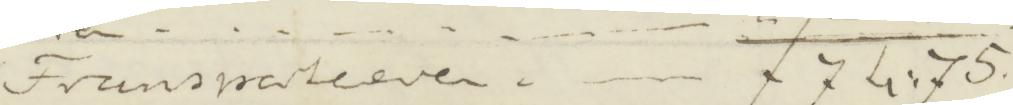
Transporteeren - - - ƒ 74„75
